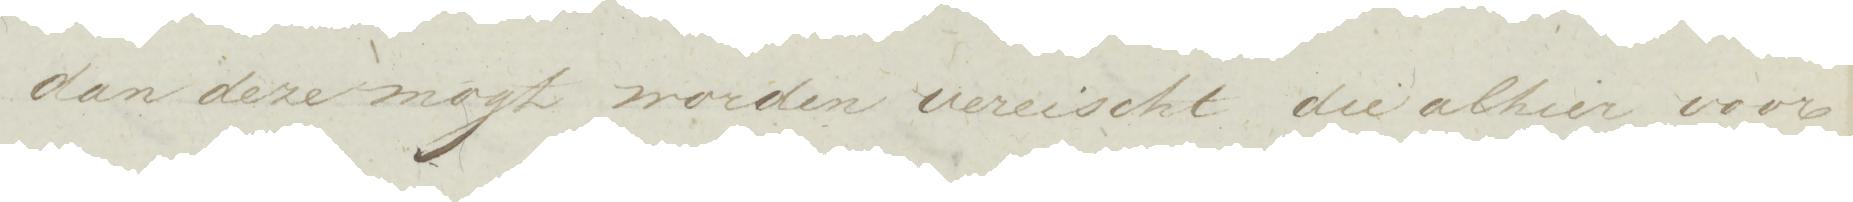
dan deze mogt worden vereischt die alhier voor
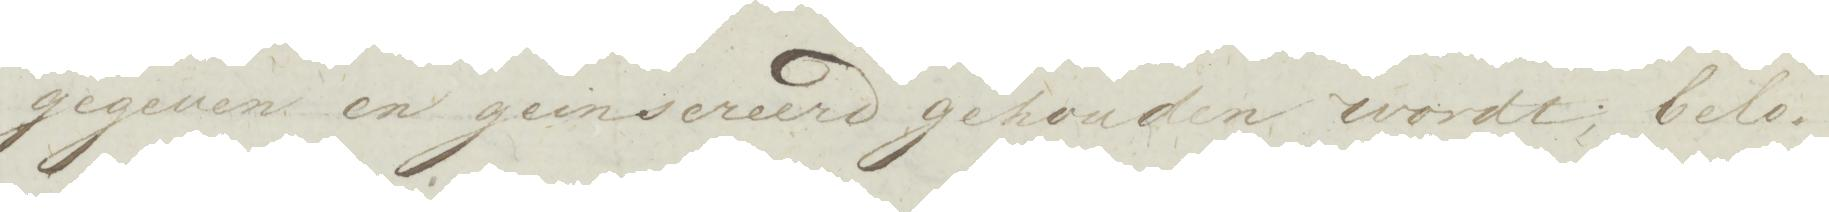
gegeven en geinsereerd gehouden wordt; belo„
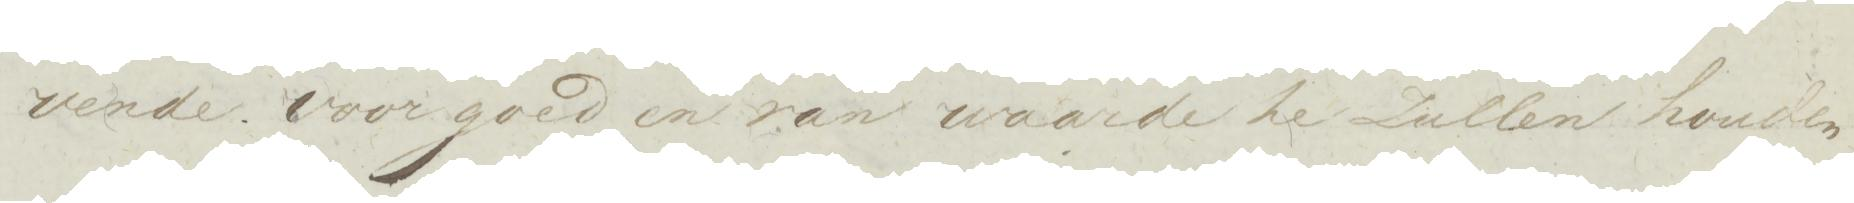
vende voor goed en van waarde te zullen houden
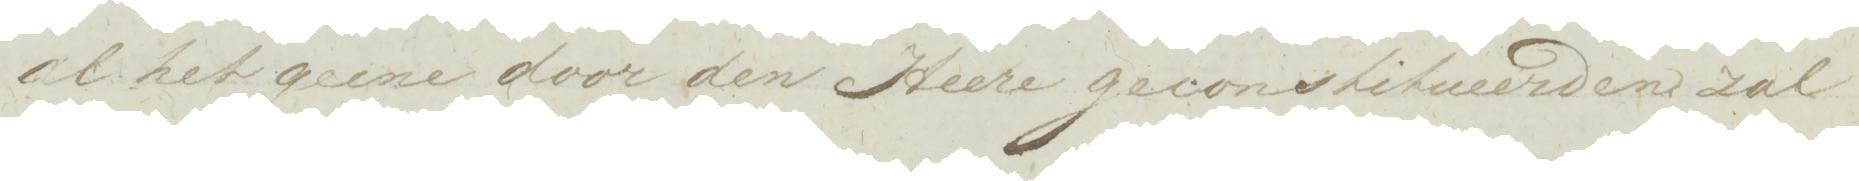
al het geene door den Heere geconstitueerden zal
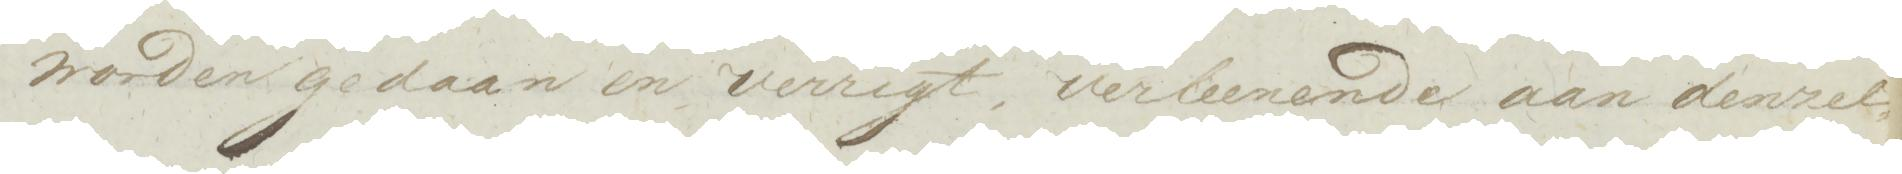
worden gedaan en verrigt, verleenende aan denzel„
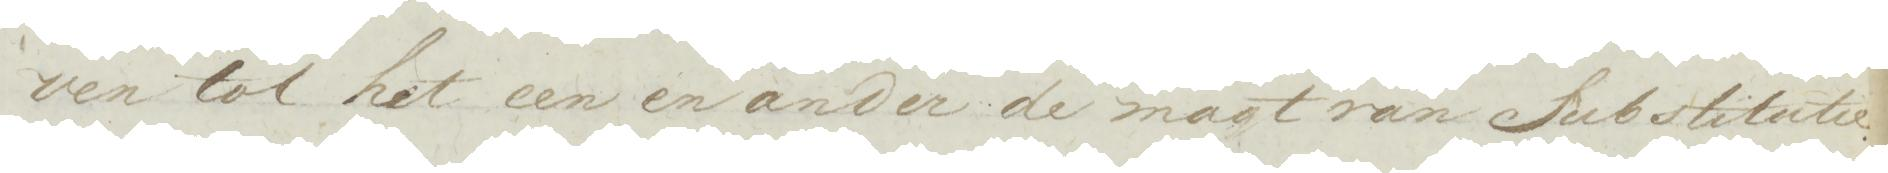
ven tot het een en ander de magt van substitutie.
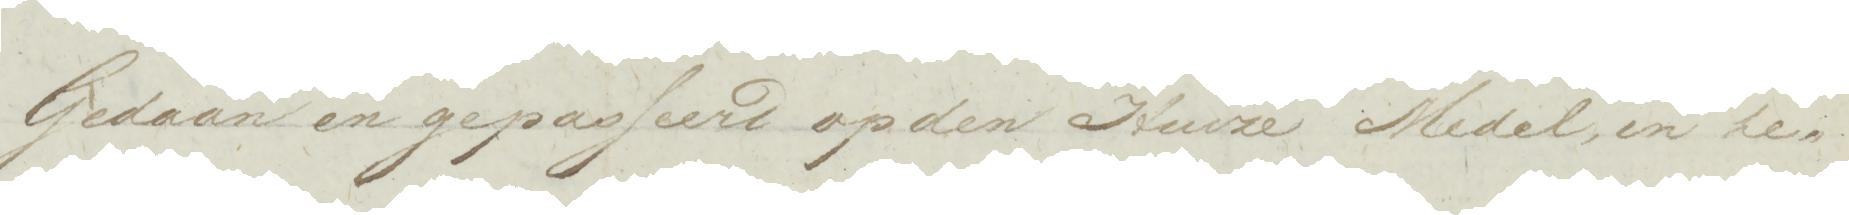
Gedaan en gepasseerd op den Huize Medel, en te„
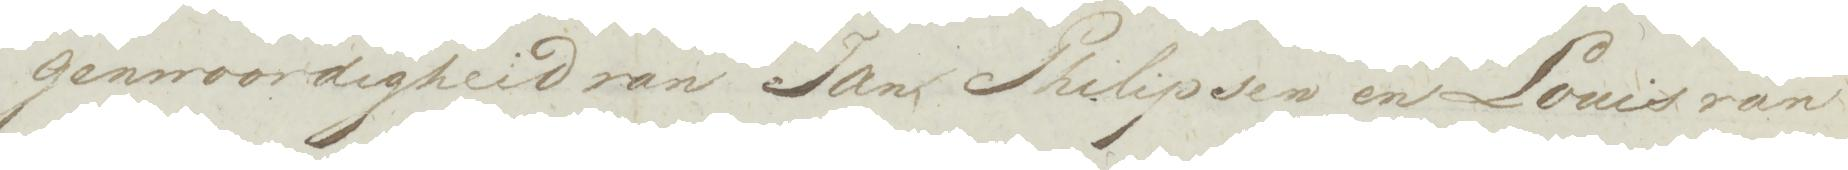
genwoordigheid van Jan Philipsen en Louis van
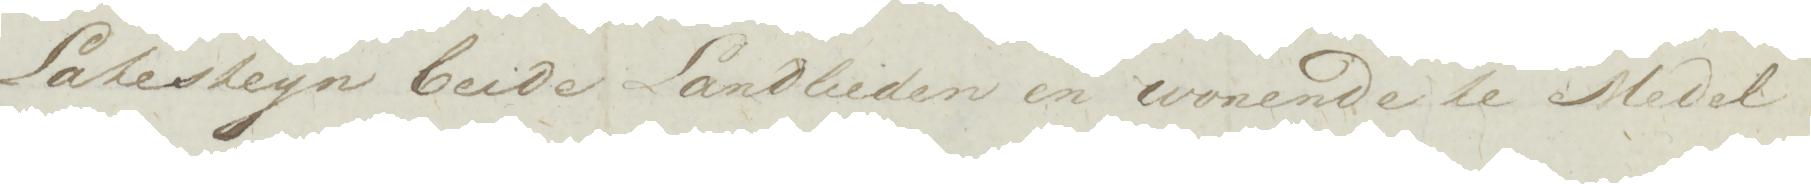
Latesteijn beide Landlieden en wonende te Medel
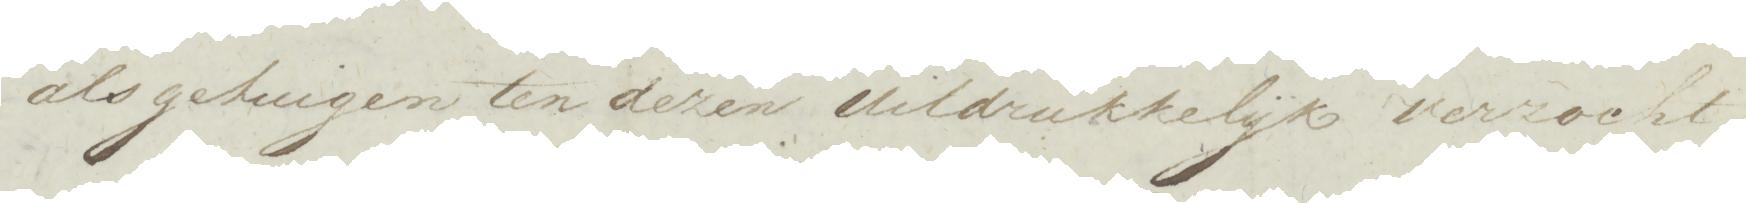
als getuigen ten dezen uitdrukkelijk verzocht
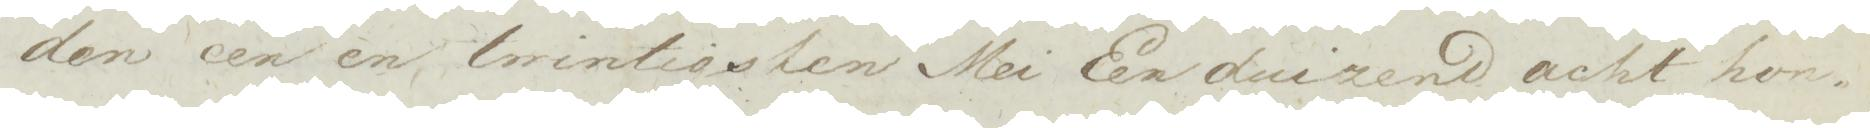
den een en twintigsten Mei Een duizend acht hon„
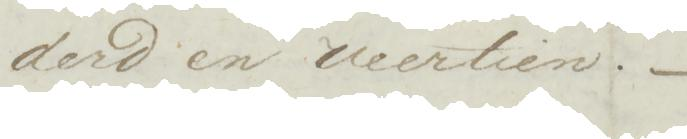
derd en veertien.
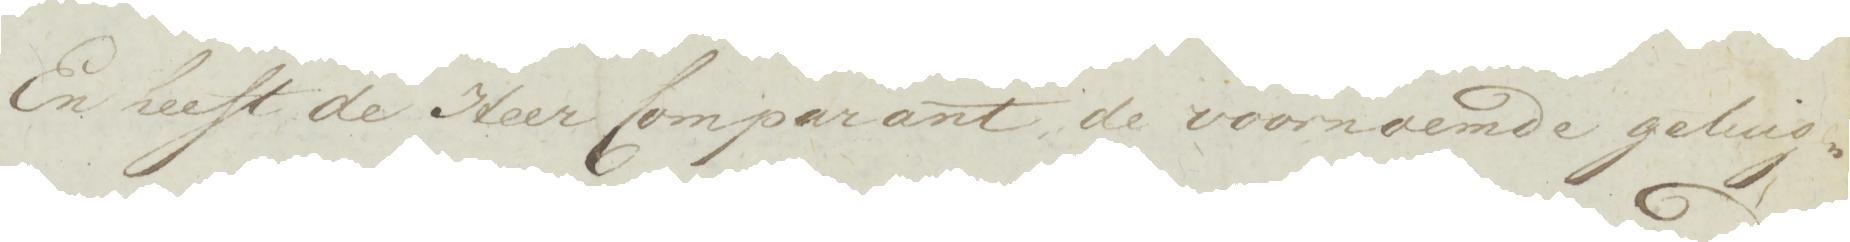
En heeft de Heer Comparant, de voornoemde getuigen
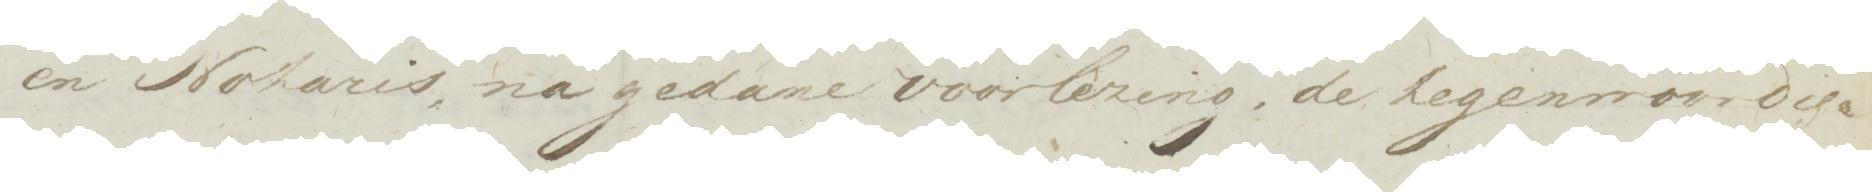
en Notaris, na gedane voorlezing, de tegenwoordige
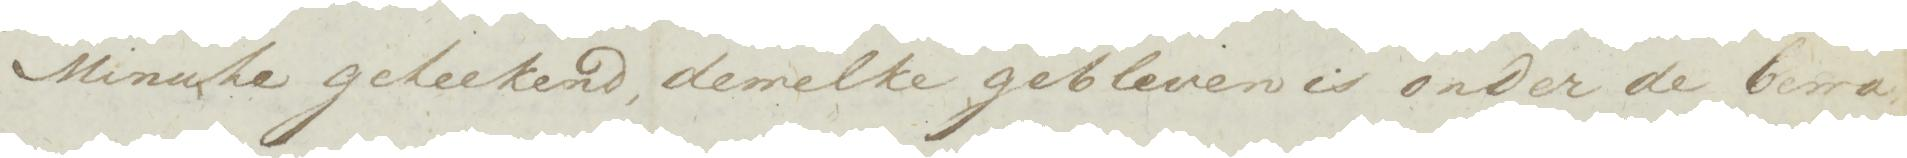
Minute geteekend, dewelke gebleven is onder de bewa„
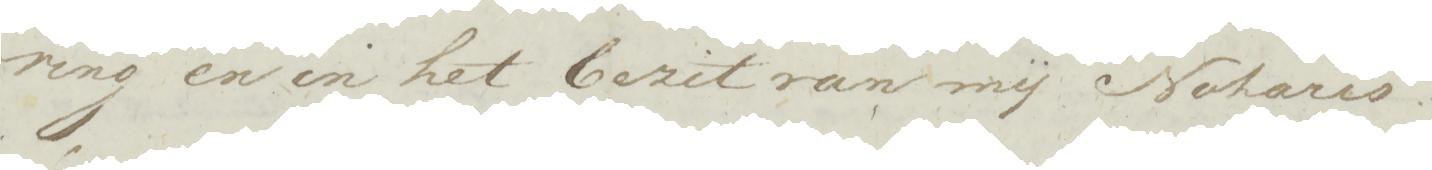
ring en in het bezit van mij Notaris
